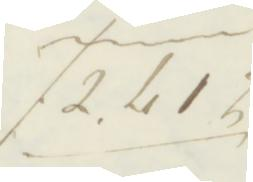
ƒ2.41½
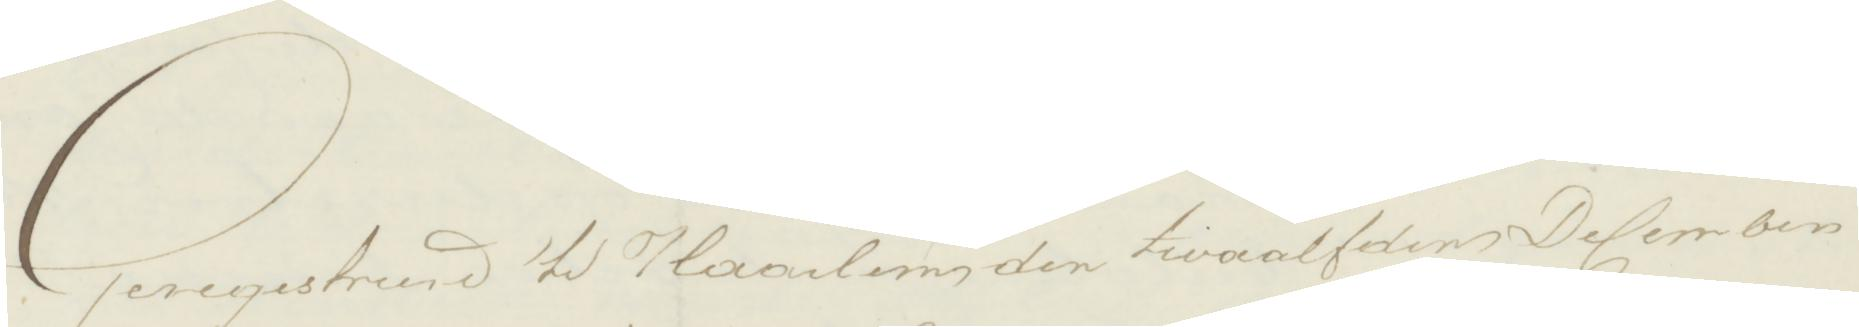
Geregeisteerd te Haarlem den twaalfden December
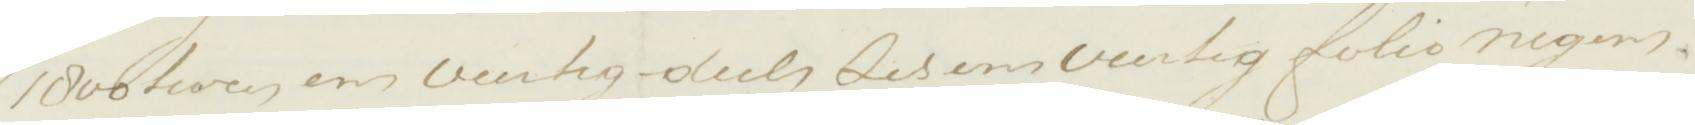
1800 twee en veertig deel zes en veertig folio negen
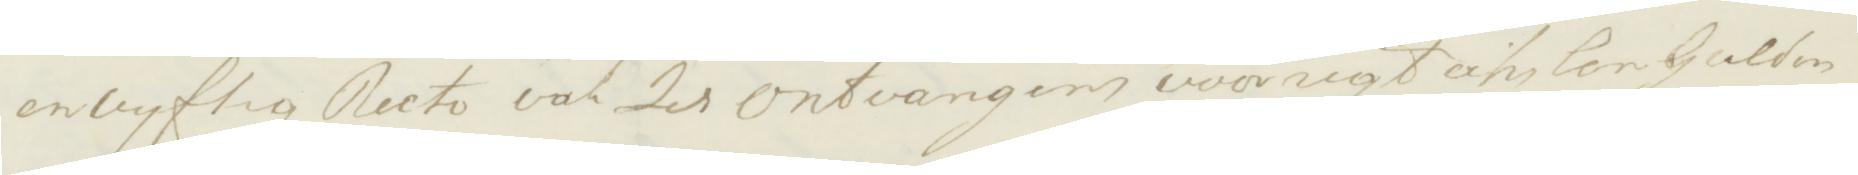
en vyftig Recto vak zes ontvangen voor regt ahs Een Gulden
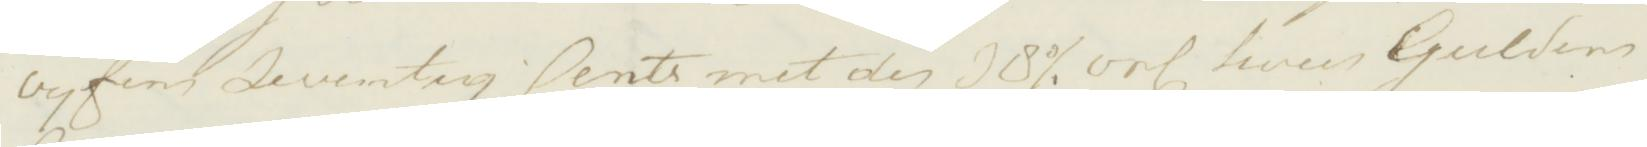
vyfen Zeventig Cents met den 38% onC twee Guldens
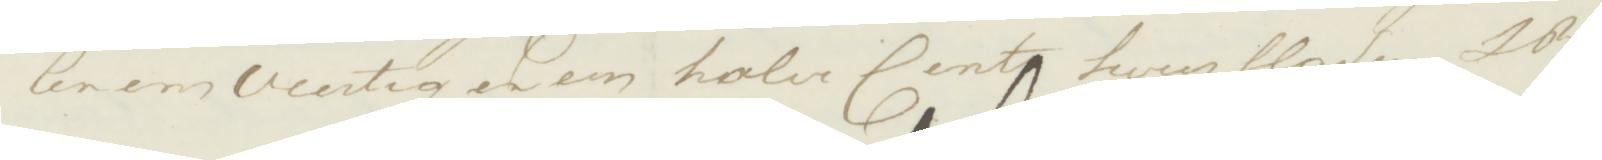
Een en veertig en een halve Cent twee bladen ZR
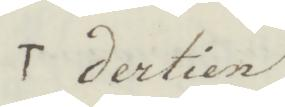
¶ dertien
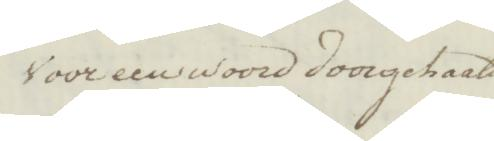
voor een woord doorgehaald
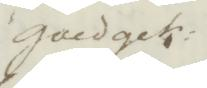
goedgek:
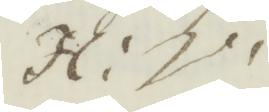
H: V:
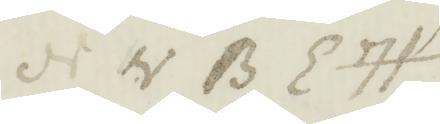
N V B E H
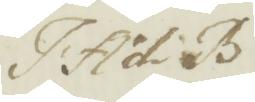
J'A'd'B
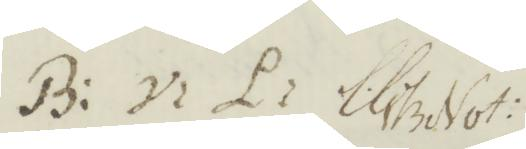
B: v: L: llB Not:
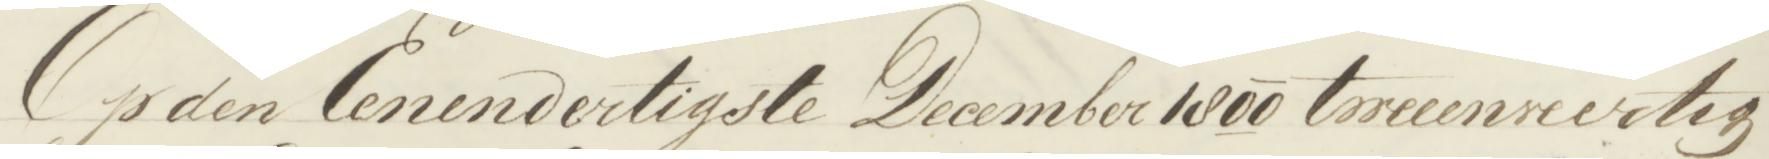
Op den Eenendertigste December 1800 tweeenveertig
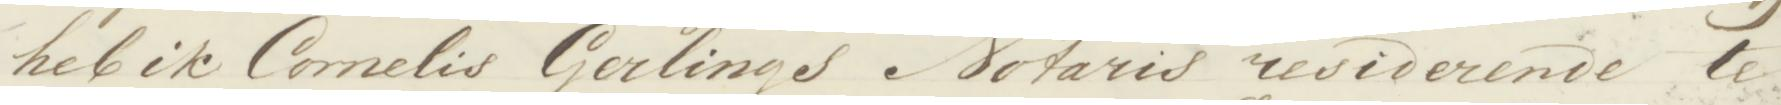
heb ik Cornelis Gerlings Notaris residerende te
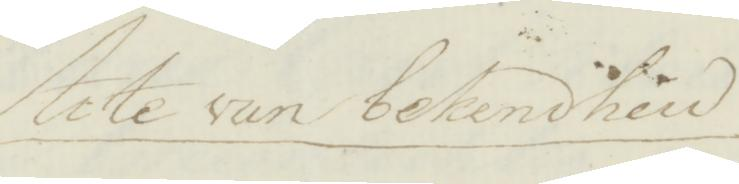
Acte van bekendheid
